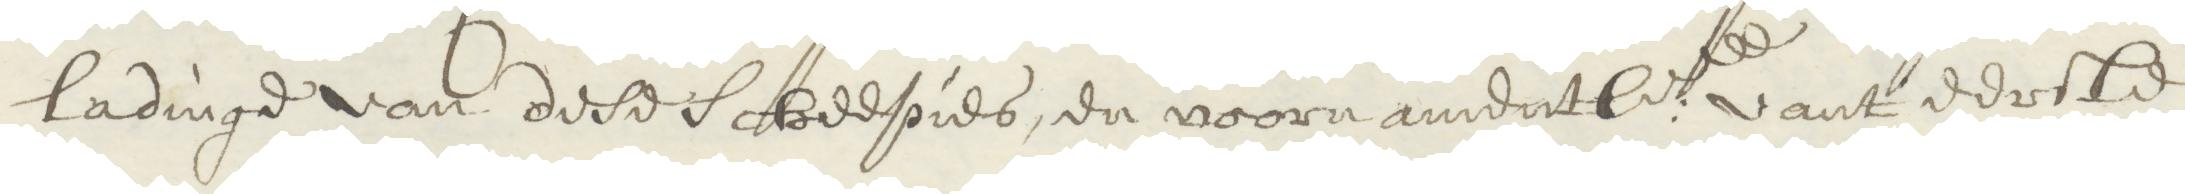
ladinge van dese scheepies, en voornamentlijk van t' eerste
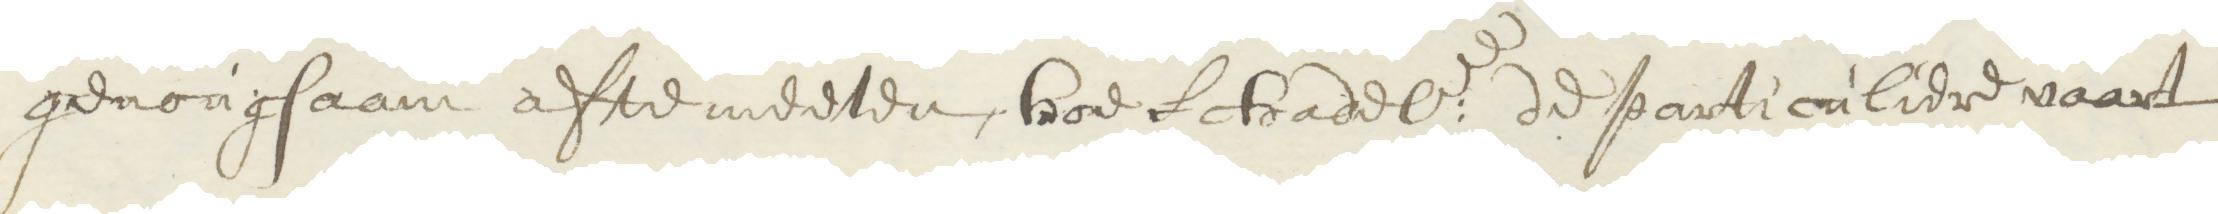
genougsaam afte meeten, hoe schadelijk de particuliere vaart
